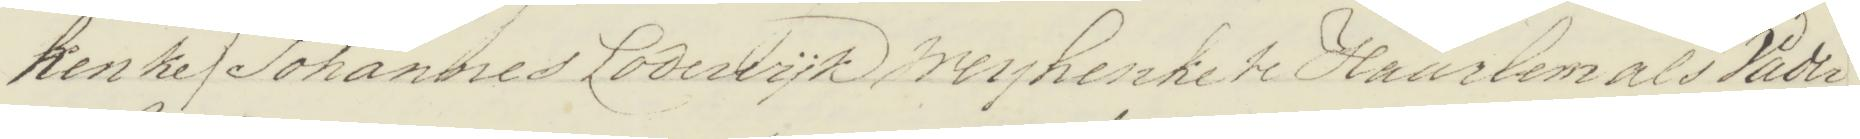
kenke/ Johannes Lodewijk Weyhenke te Haarlem als Vader
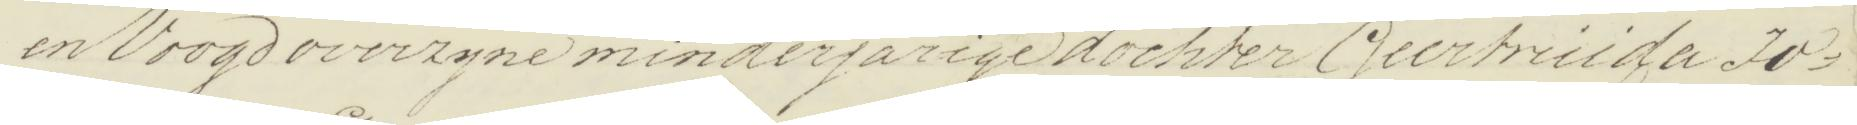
en Voogd overzyne minderjarige dochter Geertruida Io=
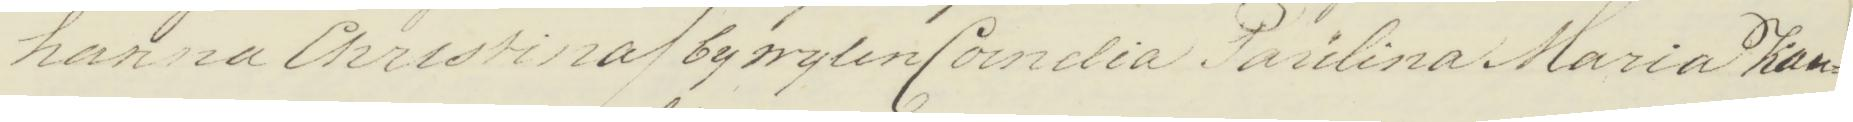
hanna Christina/ by wylen Cornelia Paulina Maria Kau=
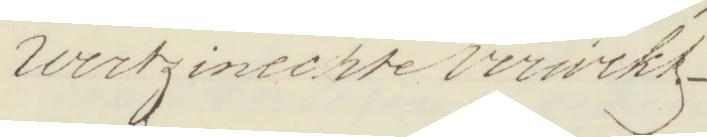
wertz inechte verwekt
